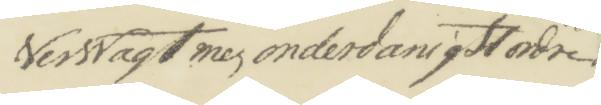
Verwagt men onderdanigst ordre.
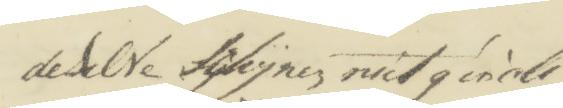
deselve schijnen niet ge'incli
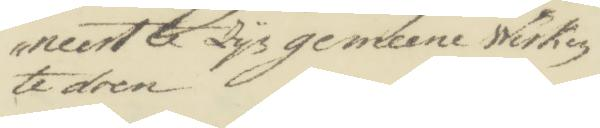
neert te zijn gemeene werken
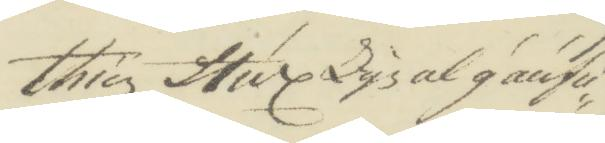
thien stux zijn al g'aufu„
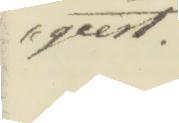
„geert.
